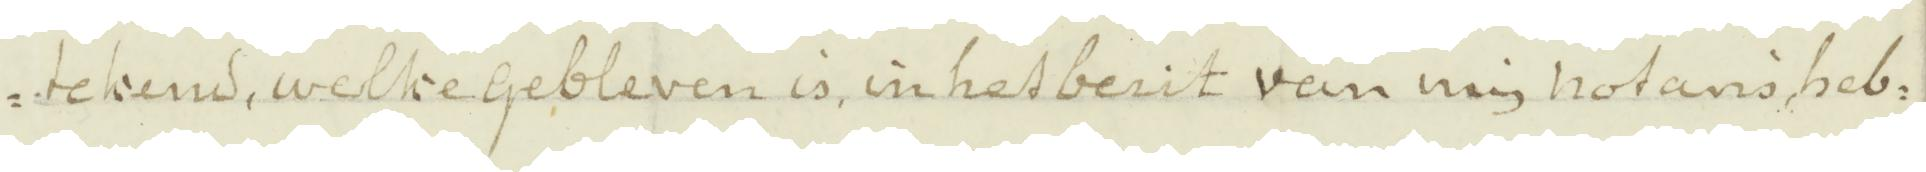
=tekend, welke gebleven is in het bezit van mij notaris, heb=
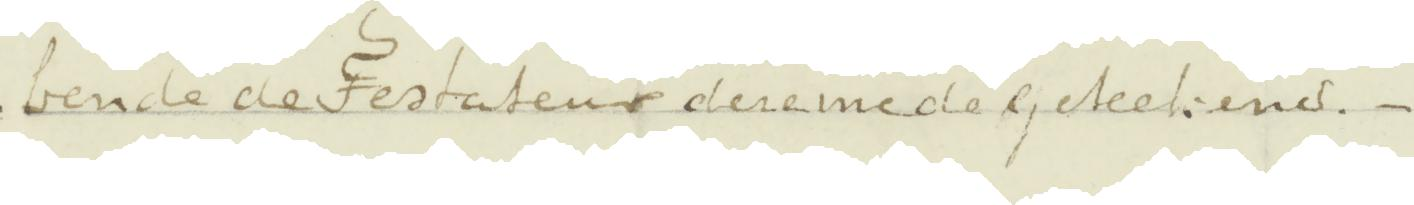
bende de Testateur deze mede geteekend.-
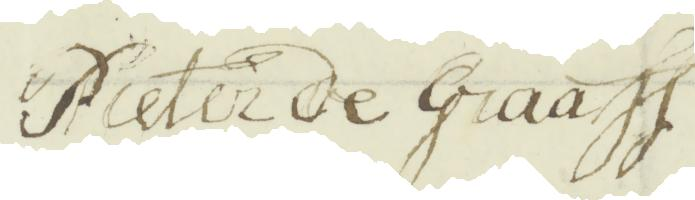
Pieter de Graaff
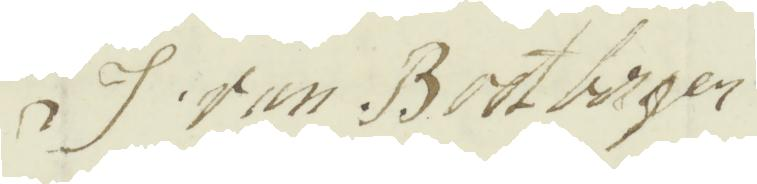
J' van Boetbergen
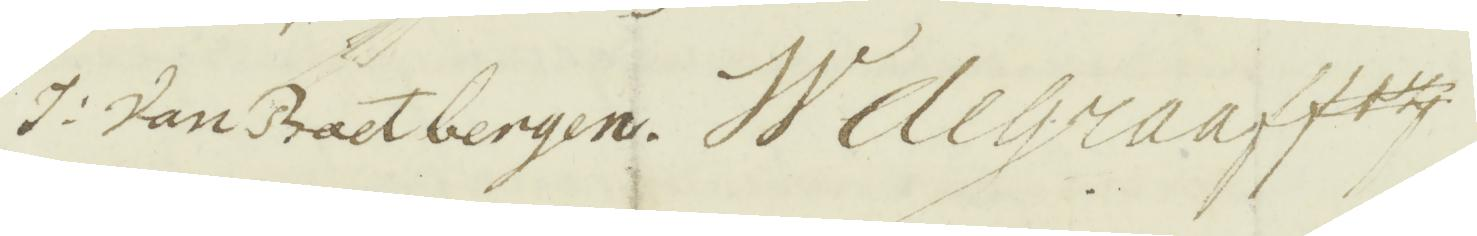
J: van Boetbergen. W de Graafftz
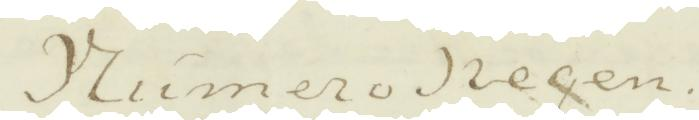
Numero Negen
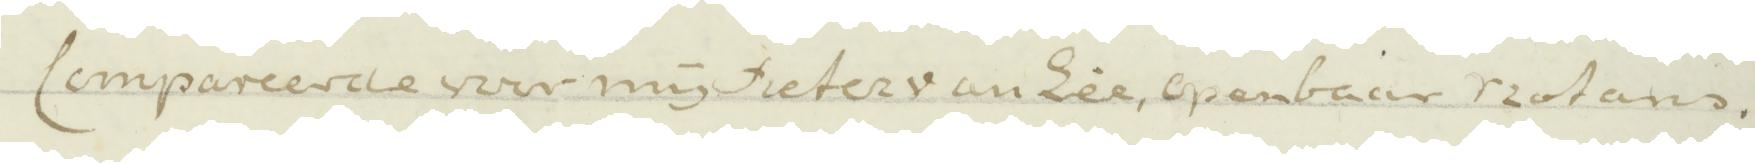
Compareerde voor mij Pieter van Lee Openbaar Notaris.
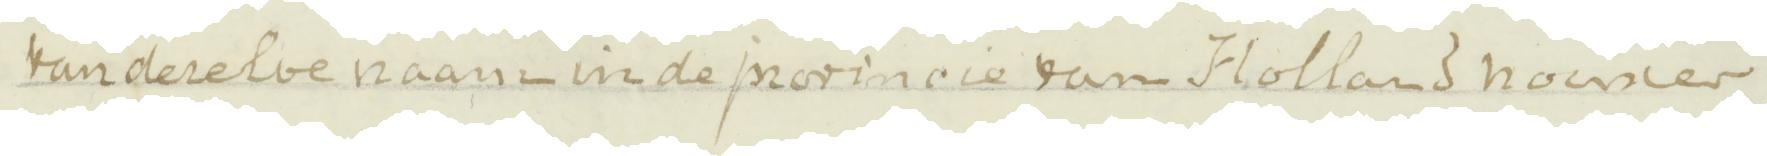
van dezelve naam in de provincie van Holland noorder
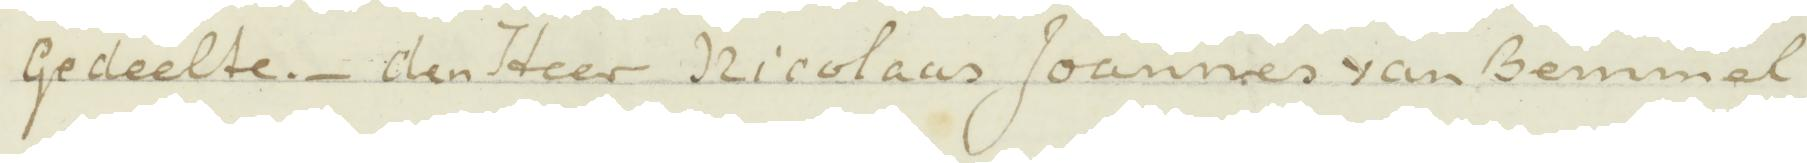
gedeelte._ den Heer Nicolaas Joannes van Bemmel
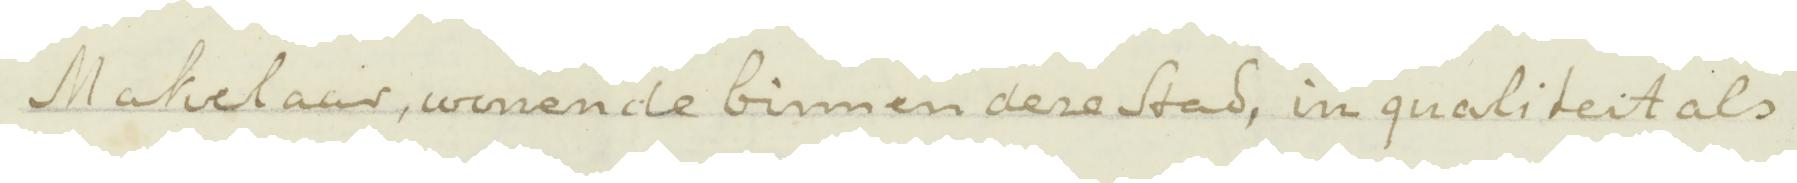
Makelaar, wonende binnen deze stad, in qualiteit als
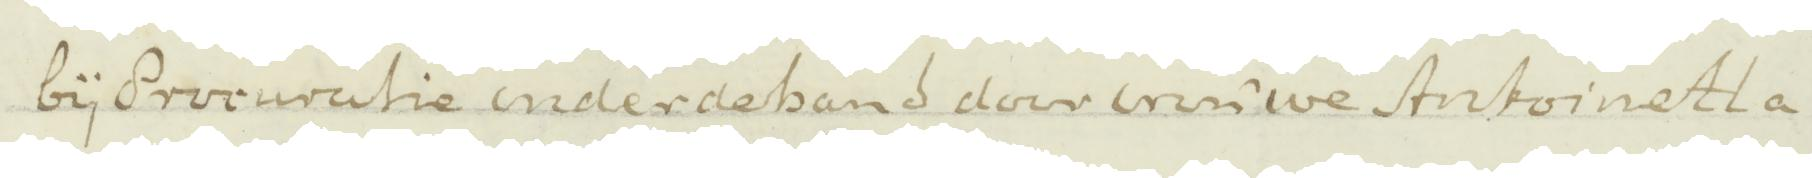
bij procuratie onder de hand door vrouwe Antoinetta
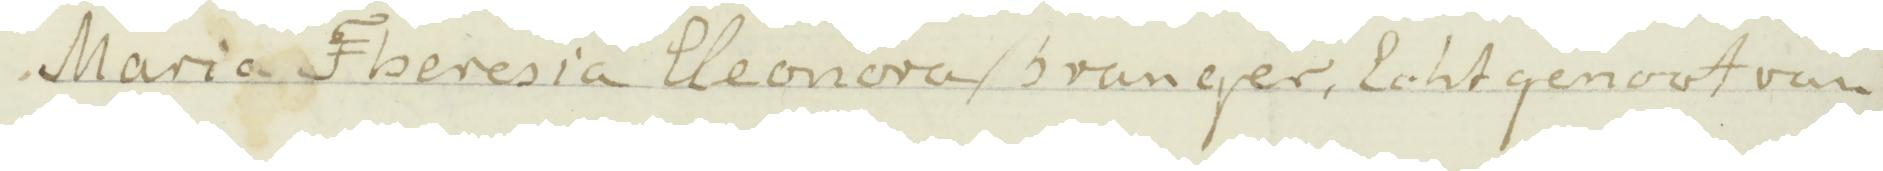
Maria Theresia Eleonora Branger, Echtgenoot van
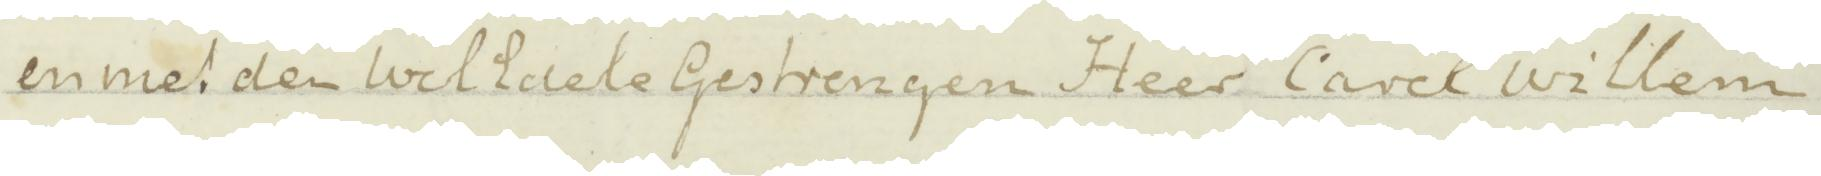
en met den wel Edele Gestrengen Heer Carel willem
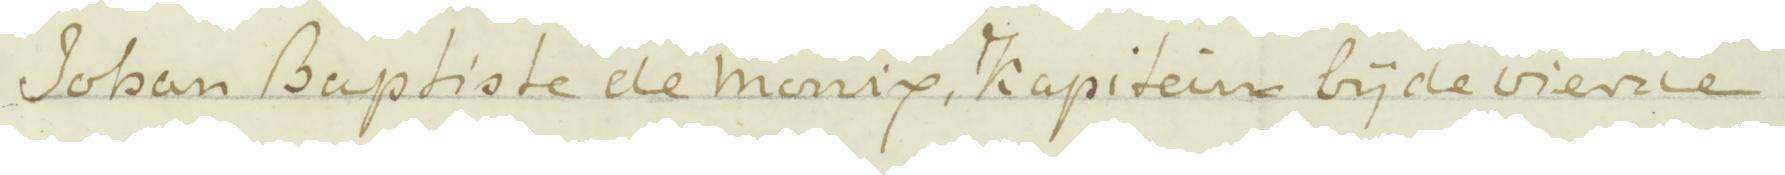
Johan Baptiste de monix, Kapitein bij de vierde
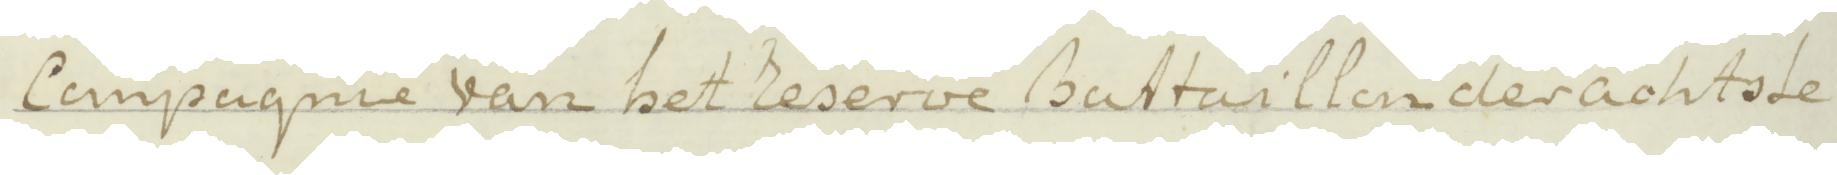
Compagnie van het reserve Battaillon der achtste
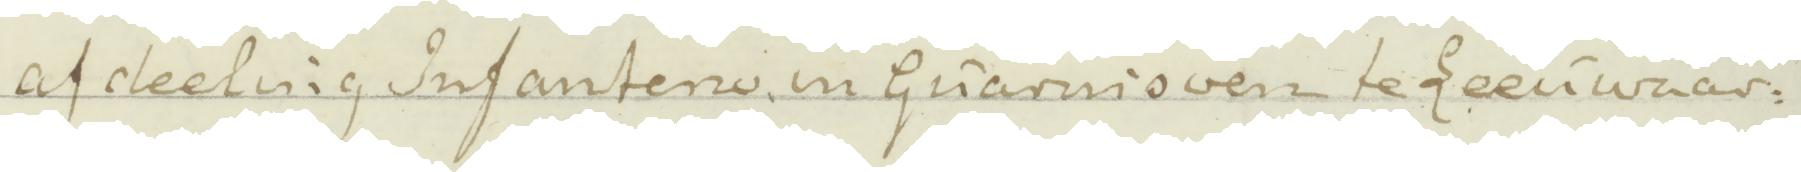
afdeeling Infanterie in Guarnisoen te Leeuwaar=
